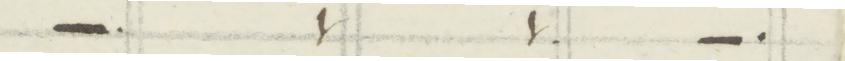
—. 1 1. —.
